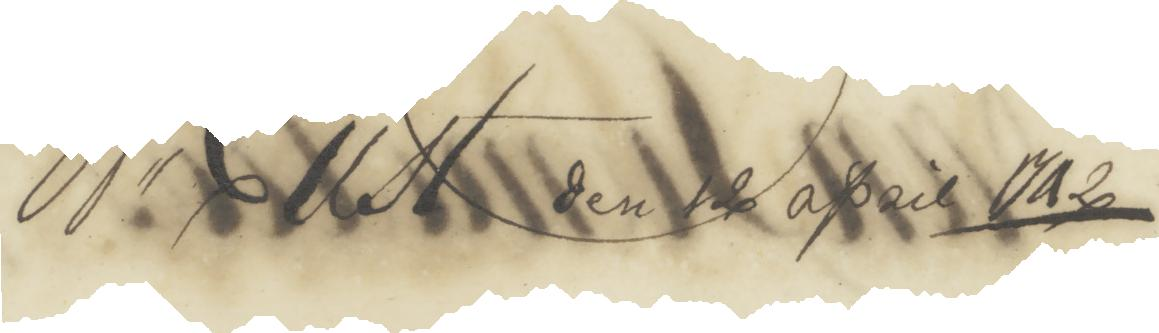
W„tCust den 12 april 1742
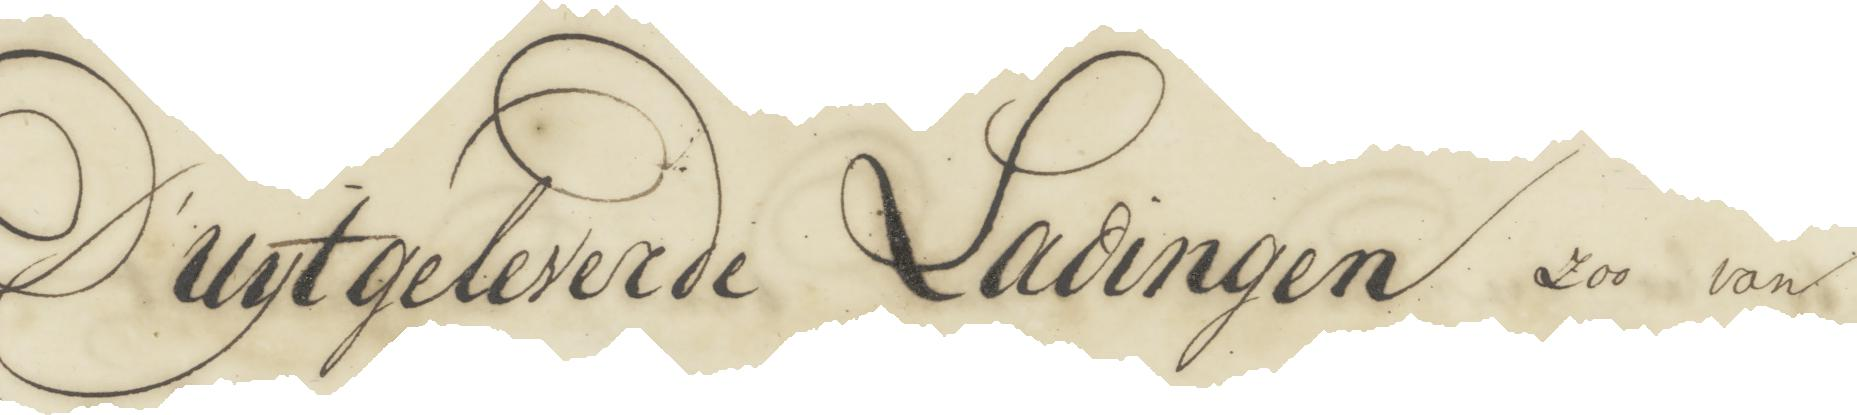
D’uytgeleverde ladingen zoo van
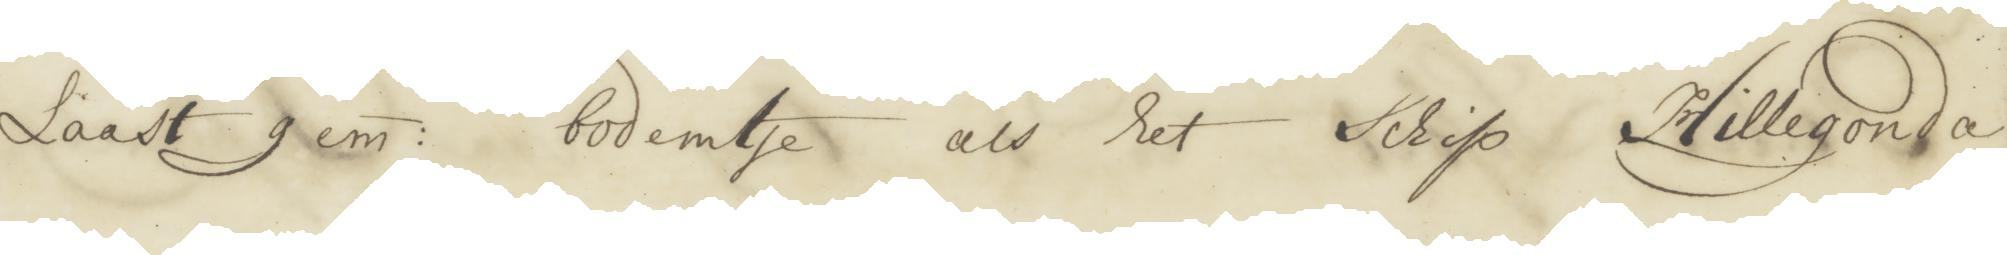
laast gem: bodemtje als het schip Hillegonda
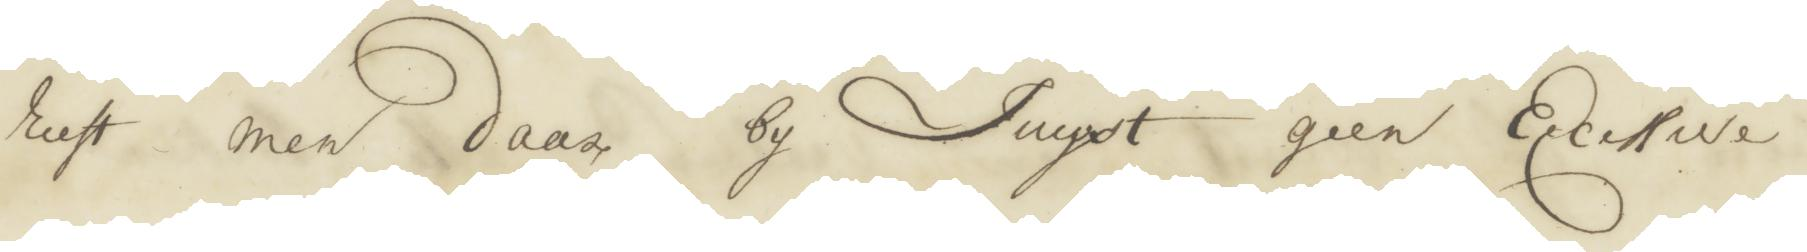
heeft men daar by juyst geen Excessive
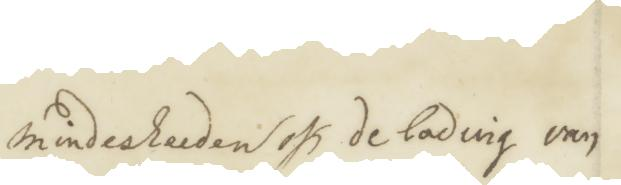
minderheeden op de lading van
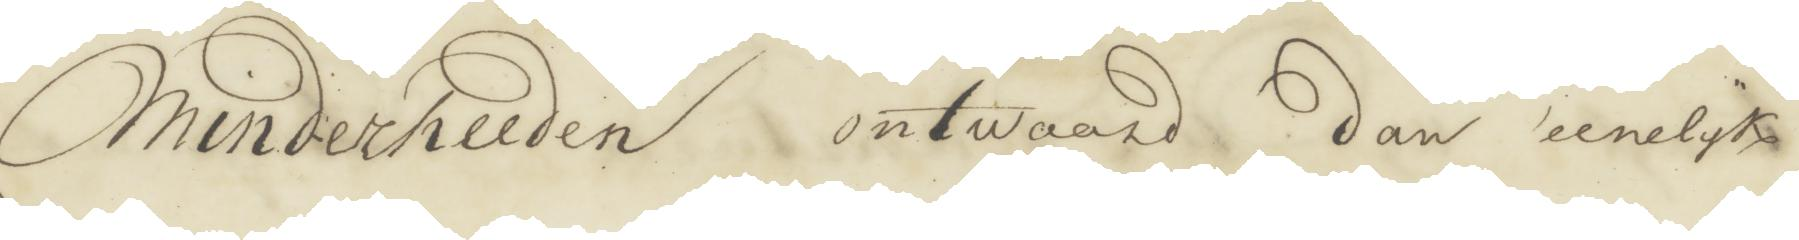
Minderheeden ontwaard dan eenelijk
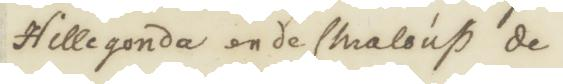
Hillegonda en de Chialoup de
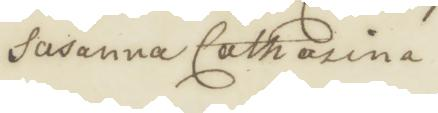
Susanna Catharina
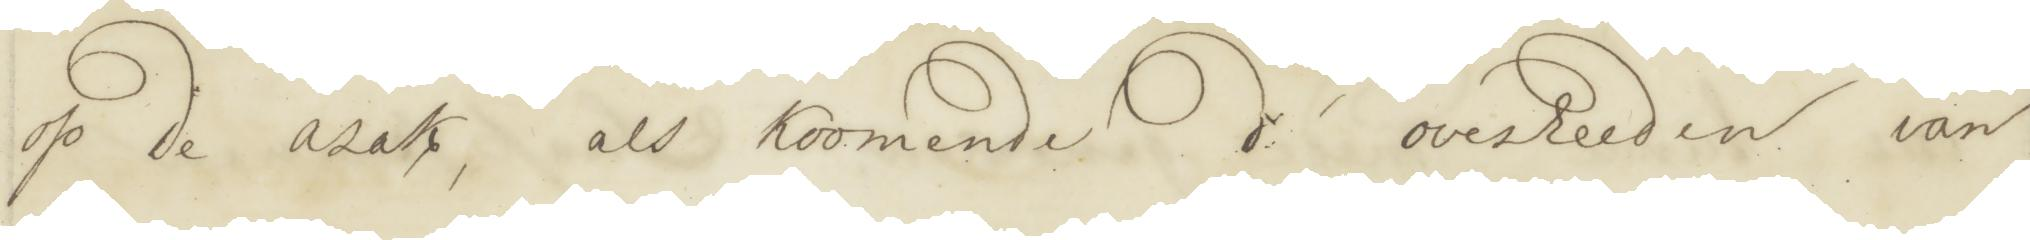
op de azak, als koomende d' overheeden van
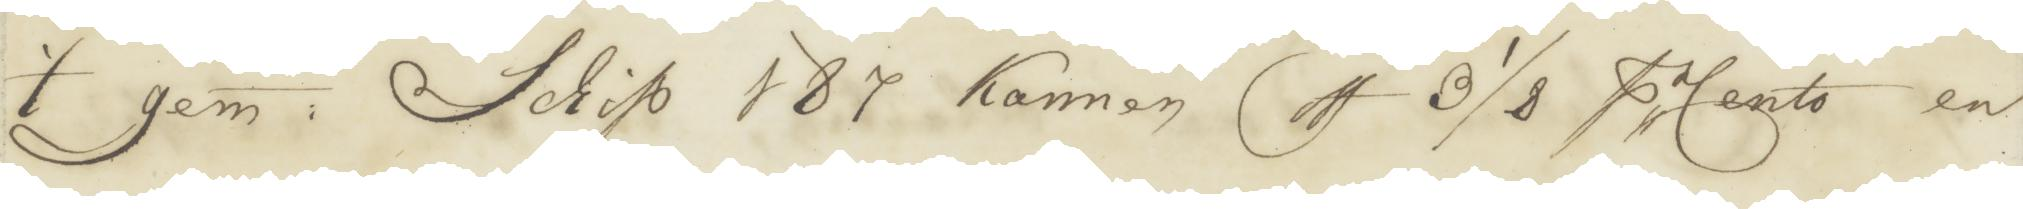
’t gem: schip 187 kannen off 3 1/8 p„r cento en
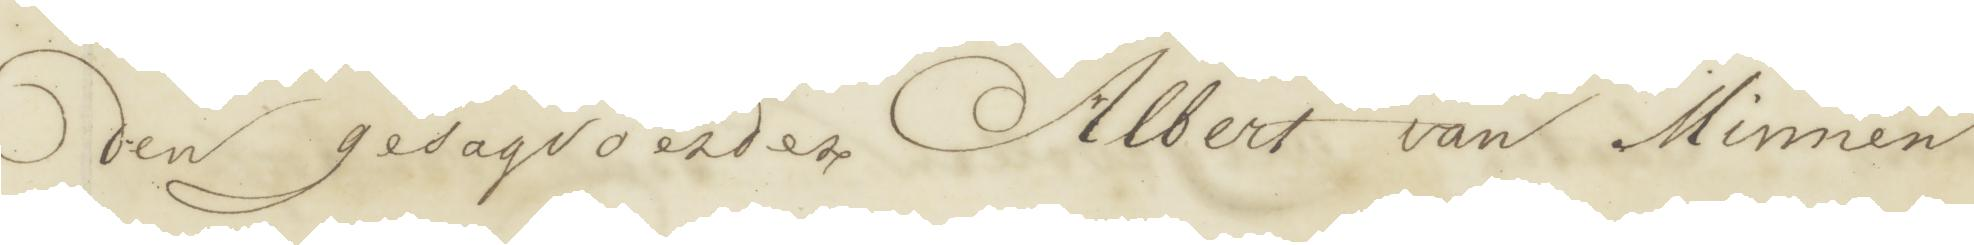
den gesagvoerder Albert van Minnen
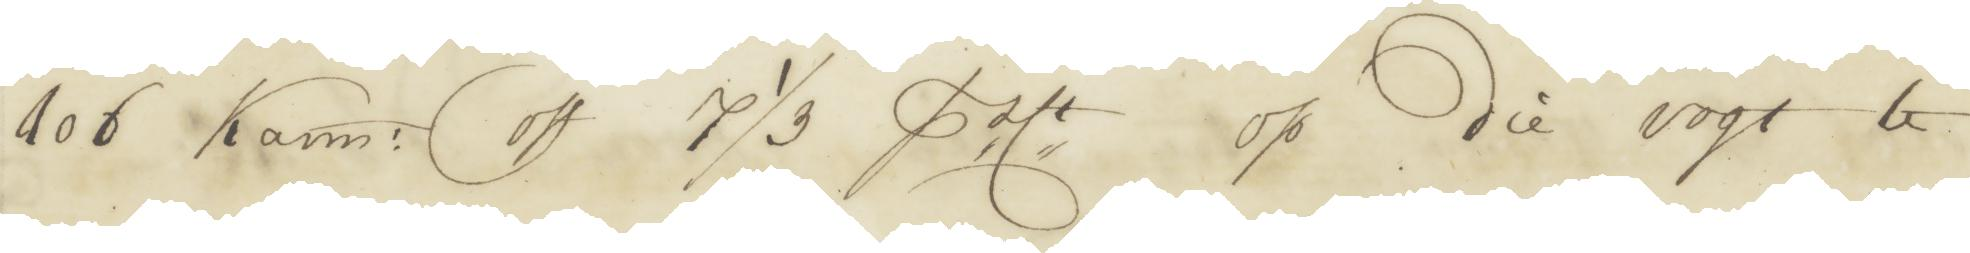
406 kann: off 7 1/3 p„r c„t op die vogt te
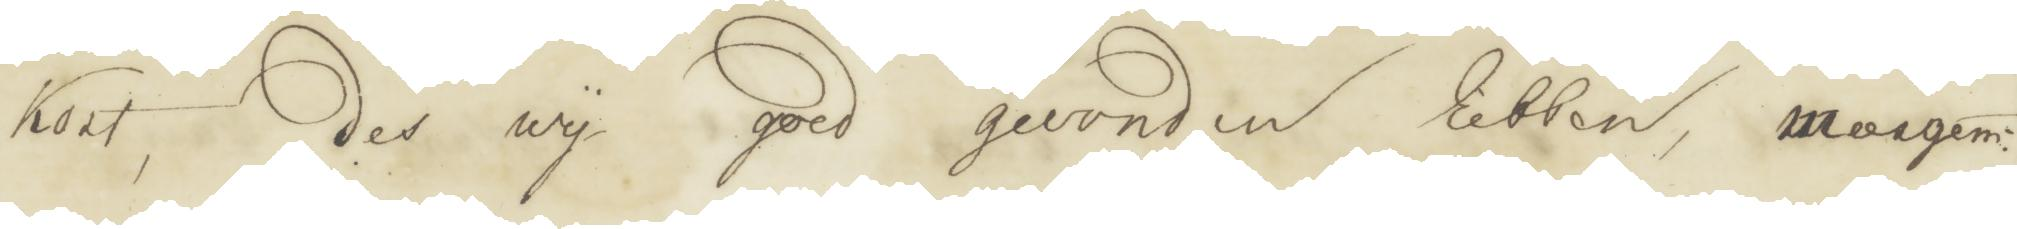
kort, des wij goed gevonden hebben, meergem:
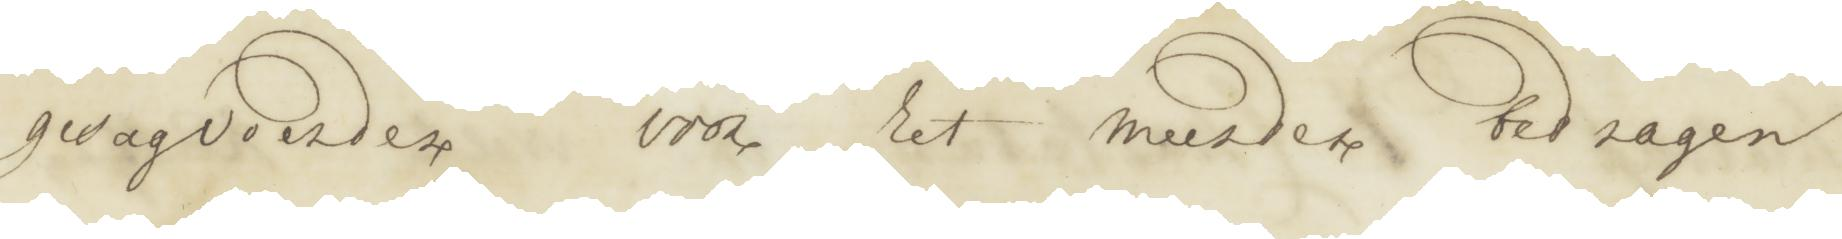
gesagvoerder voor het meerder bedragen
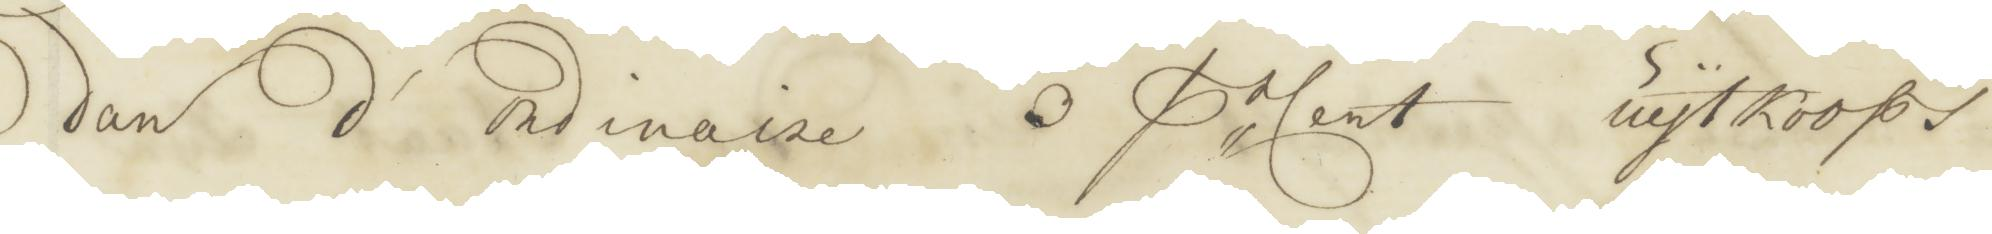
dan d' ordinaire 0 p„r cent uijtkoops
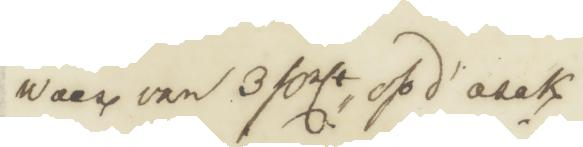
waar van 3 pr c,t op d’ arak
